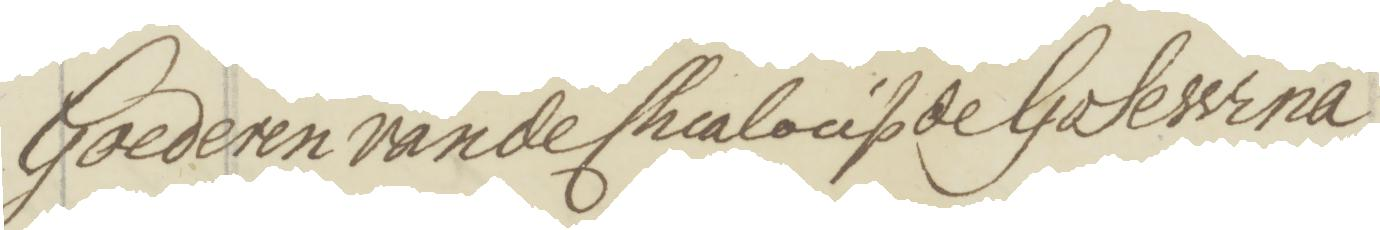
Goederen van de Chialoup de Gosevverna
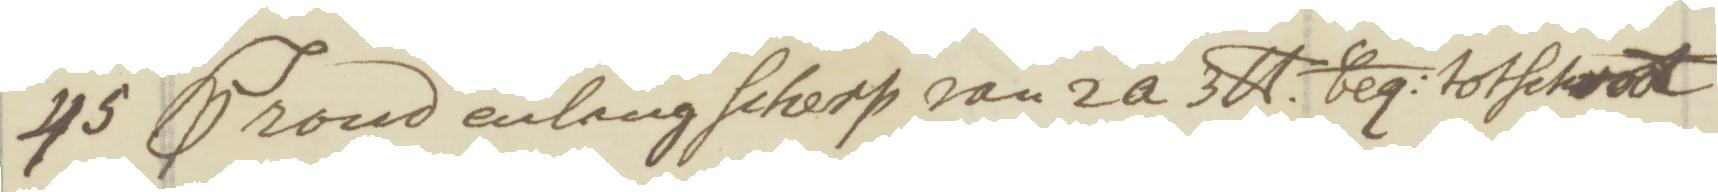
45 ps rond en lang scherp van 2 a 3 lb. beq: tot schroodt
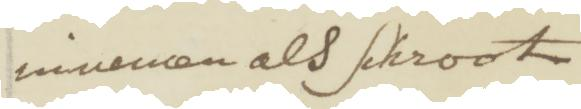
innemen als schroot
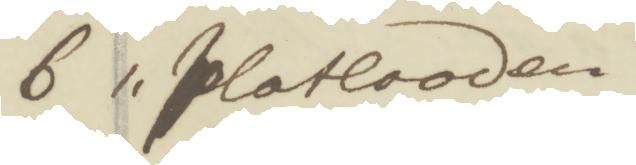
6 „ platlooden
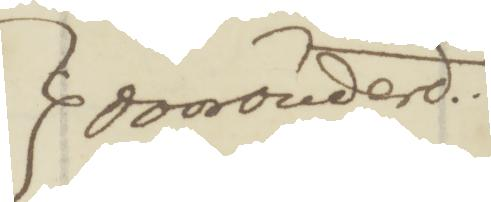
|door ouderd:
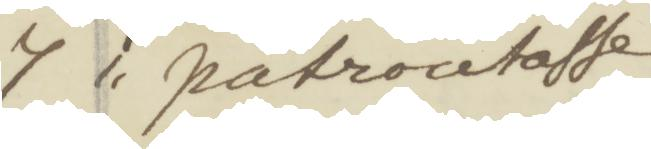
7 „ patroontasse
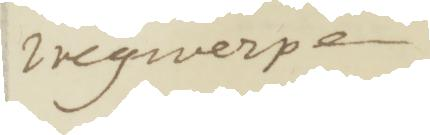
wegwerpen
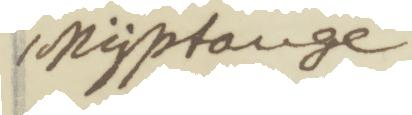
„ Nijptange
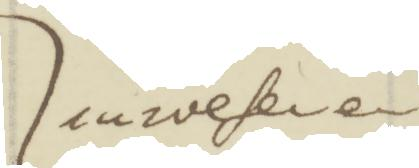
in wesen en
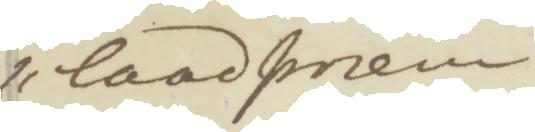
„ laadpriem
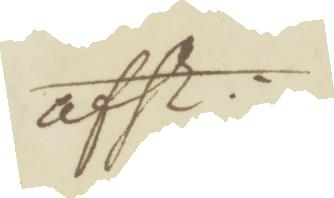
affh.
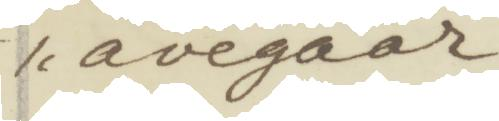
„ avegaar
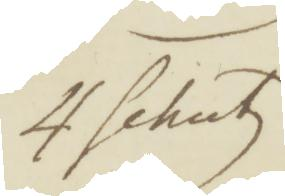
4 schut
